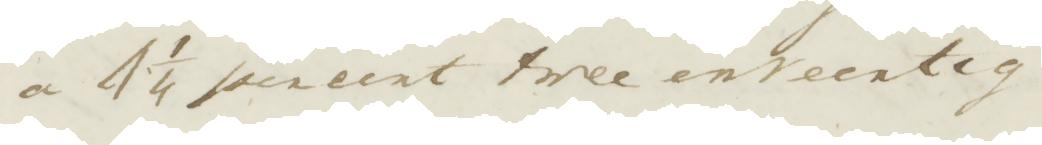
a 4¼ percent twee en veertig
